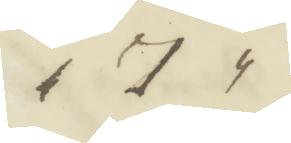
7 „
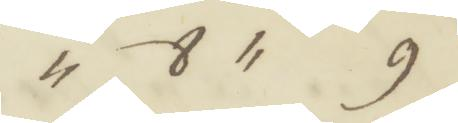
„ 8 „ 9
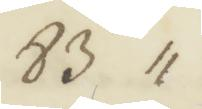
83 „
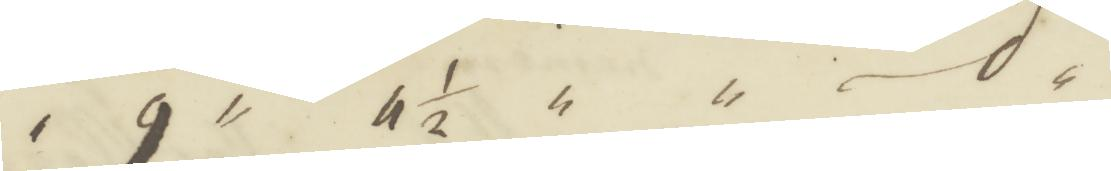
„ 9 „ 4½ „ „ d„o
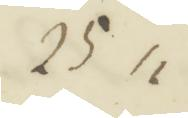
25
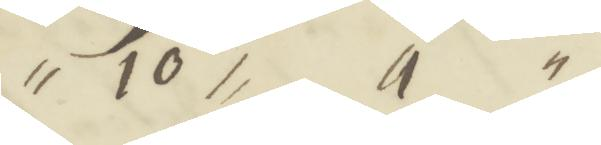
„ 10 „ 4 „
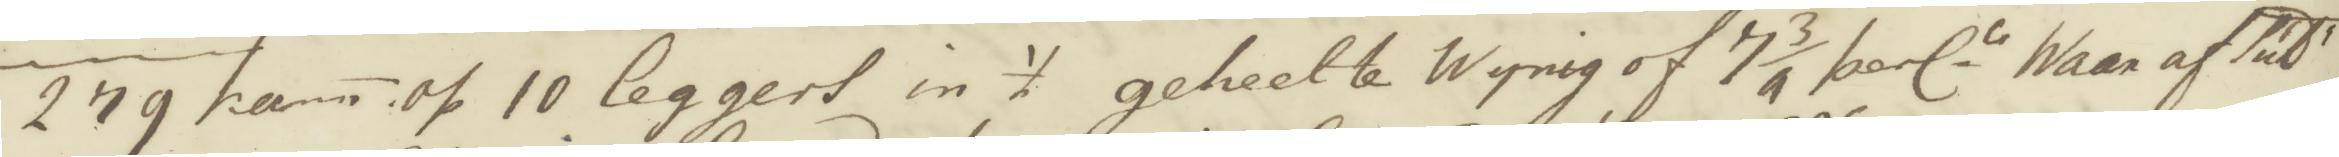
279 kann: op 10 leggers in ’t geheel te wijnig of 7¾ perC=to waar af sud'
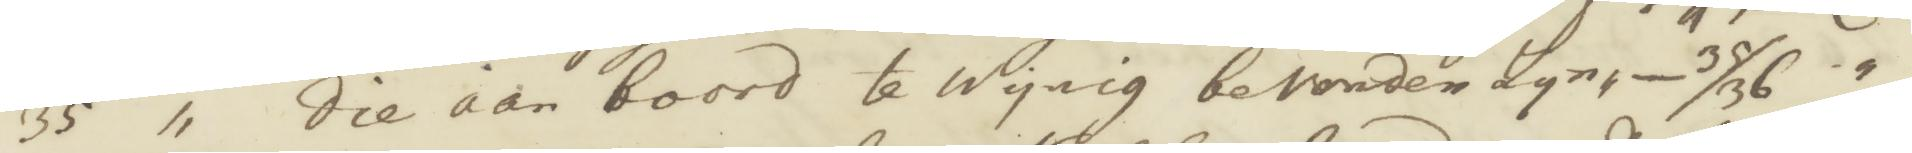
35 „ die aan boord te wijnig bevonden zyn„ — 35/36 - „
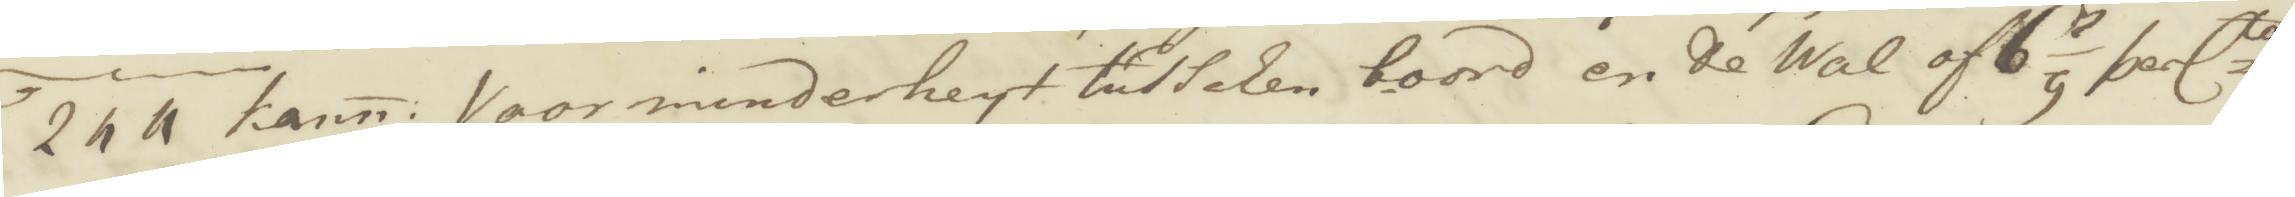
244 kann: voor minderheyt tusschen boord en de wal of 6 7/9 perC=to
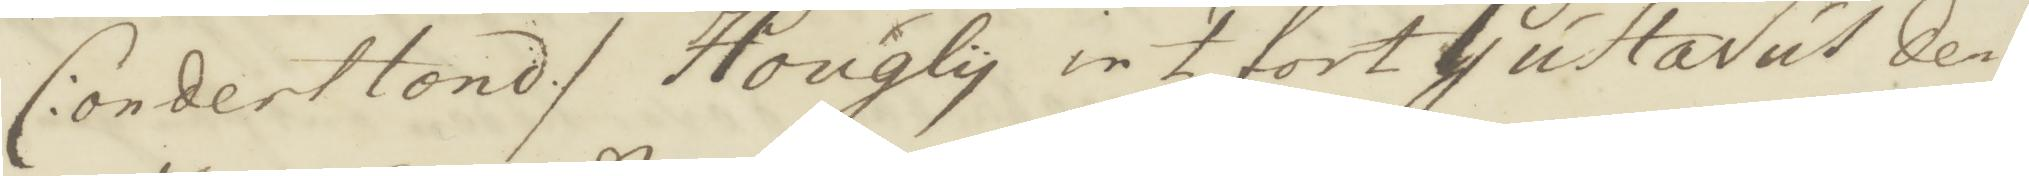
(:onderstond:/ Houglij in ’t fort Gustavus den
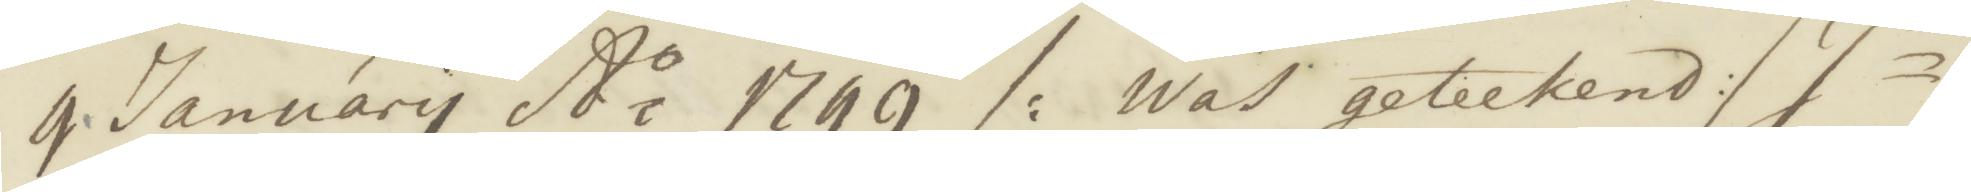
4 Ianuarij A=o 1749 /: was geteekend:/ J=n
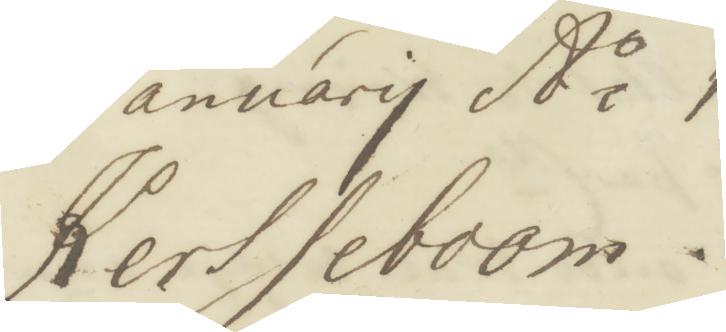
Kersseboom.
